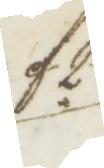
f.2
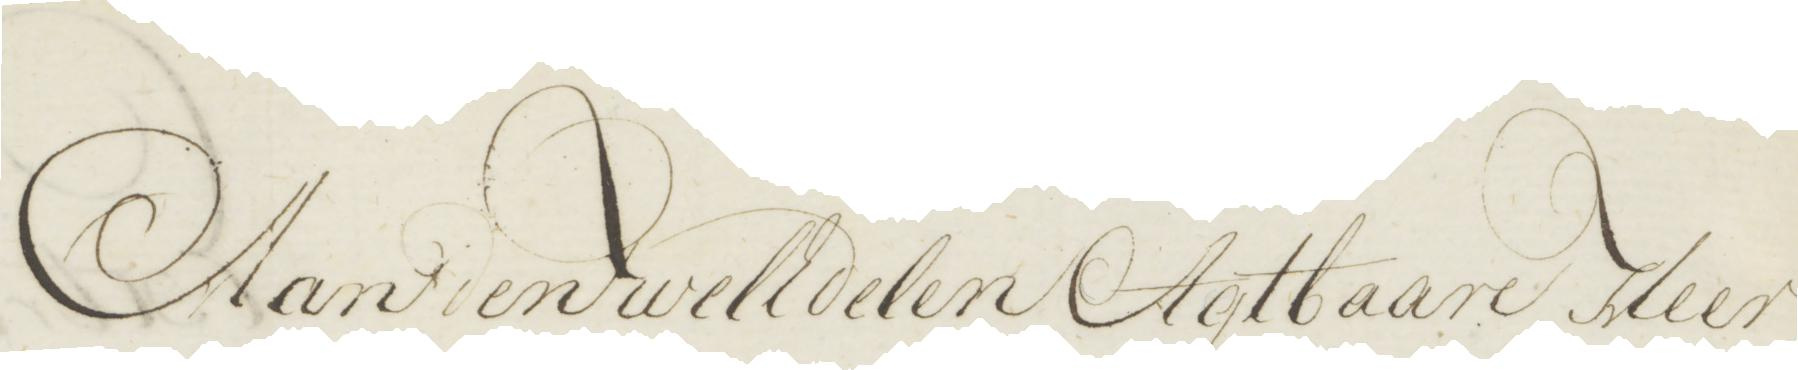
Aan den wel Edelen Agtbaare Heer
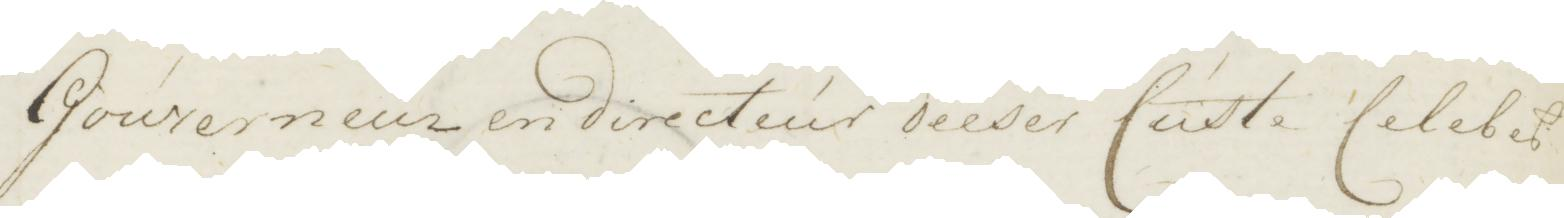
Gouverneur en directeur deeser Custe Celebes
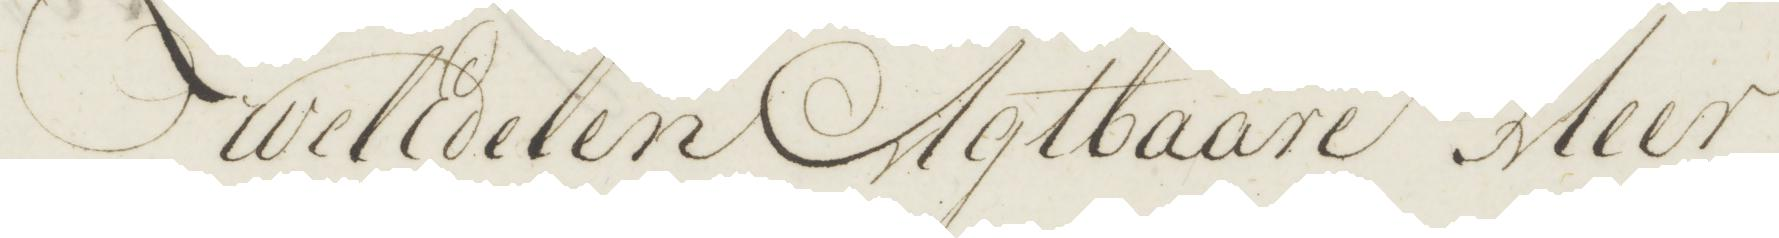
Wel Edelen Agtbaare Heer
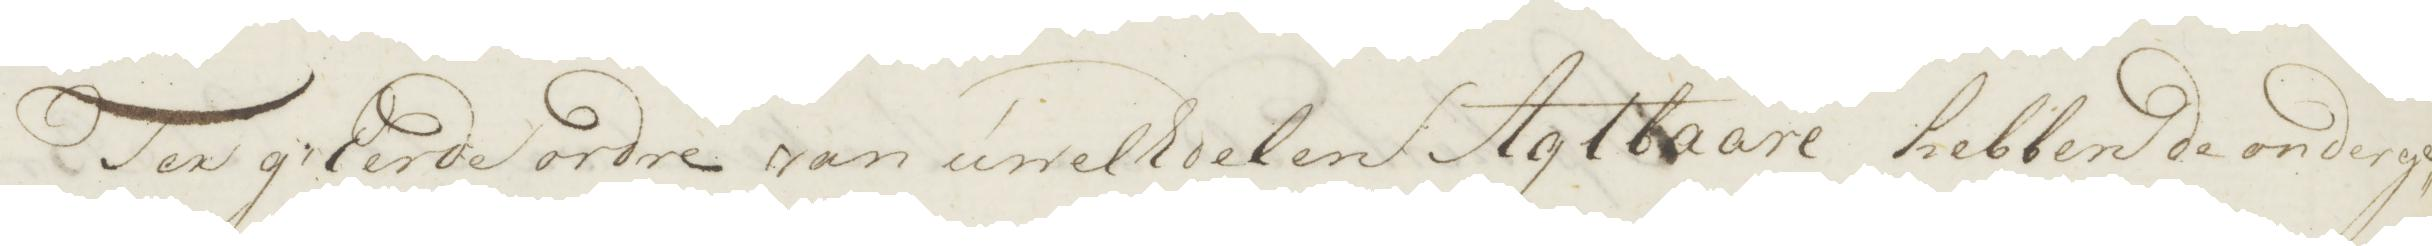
Ter g'Eerde ordre van uwel Edelen Agtbaare hebben de onderge„
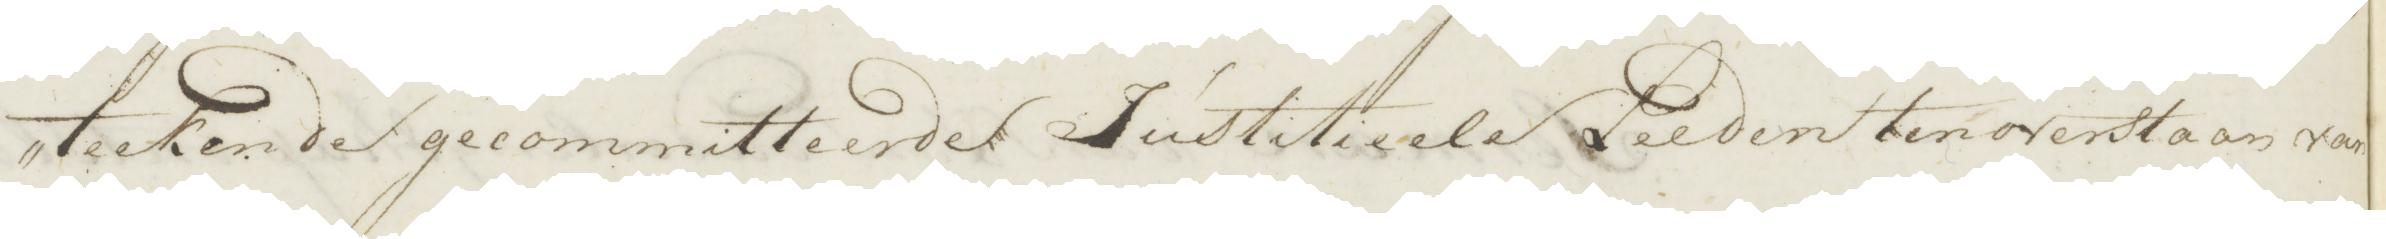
„teekende gecommitteerde Iustitieele Leeden ten overstaan van
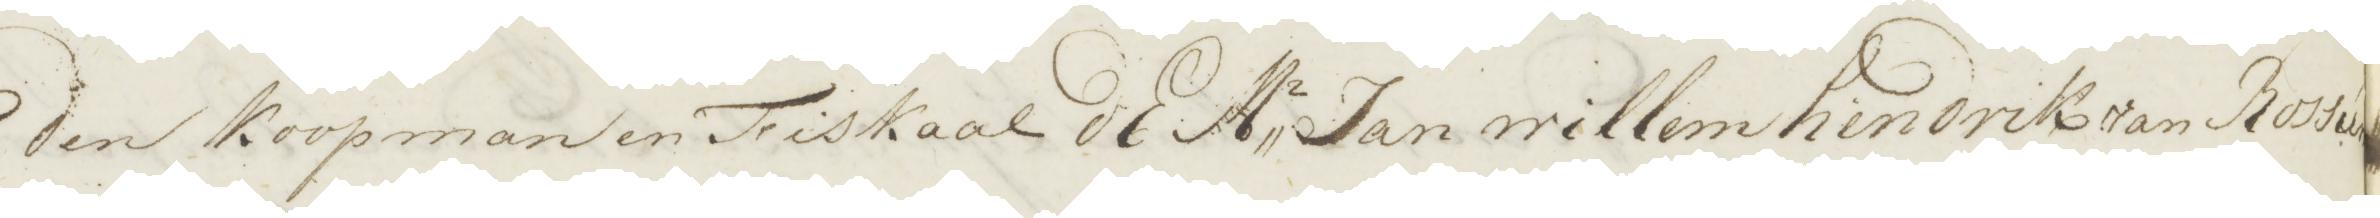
den koopman en Fiskaal d'E H„r Ian willem hendrik van Rossu
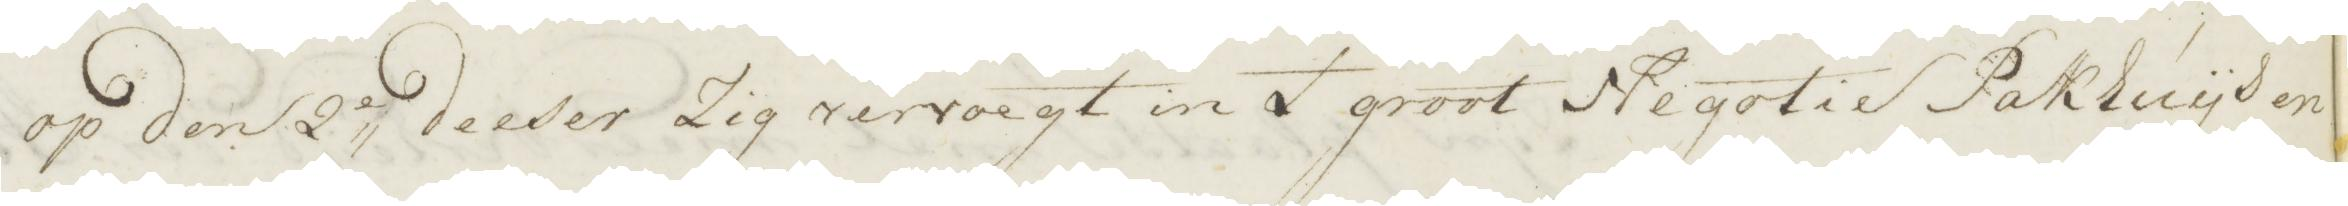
op den 2„e deeser zig vervoegt in t groot Negotie Pakhuijs en
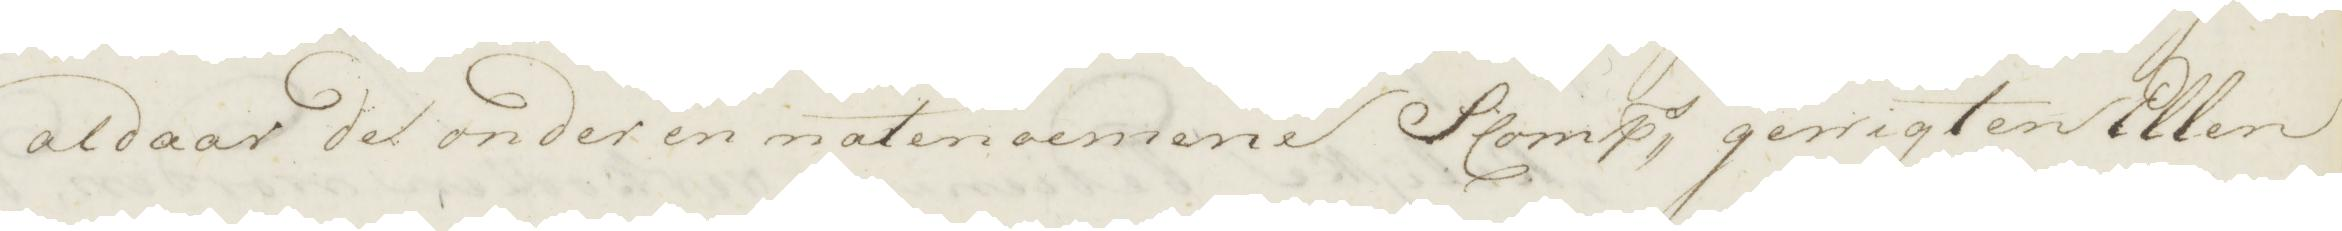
aldaar de onder en natenoemene SComp„s gewigten Ellen
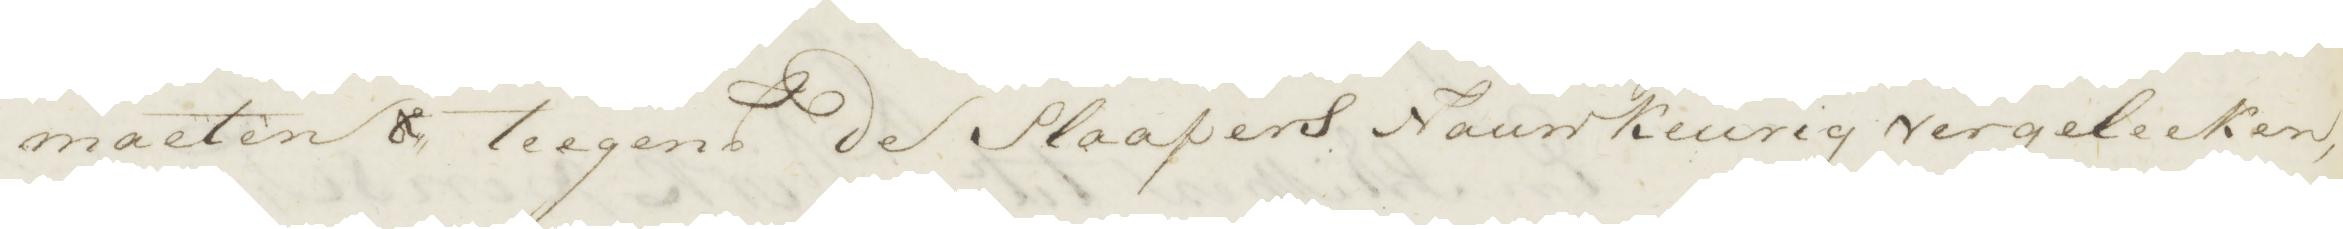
maeten &„ teegens de slaapers Nauwkeurig vergeleeken,
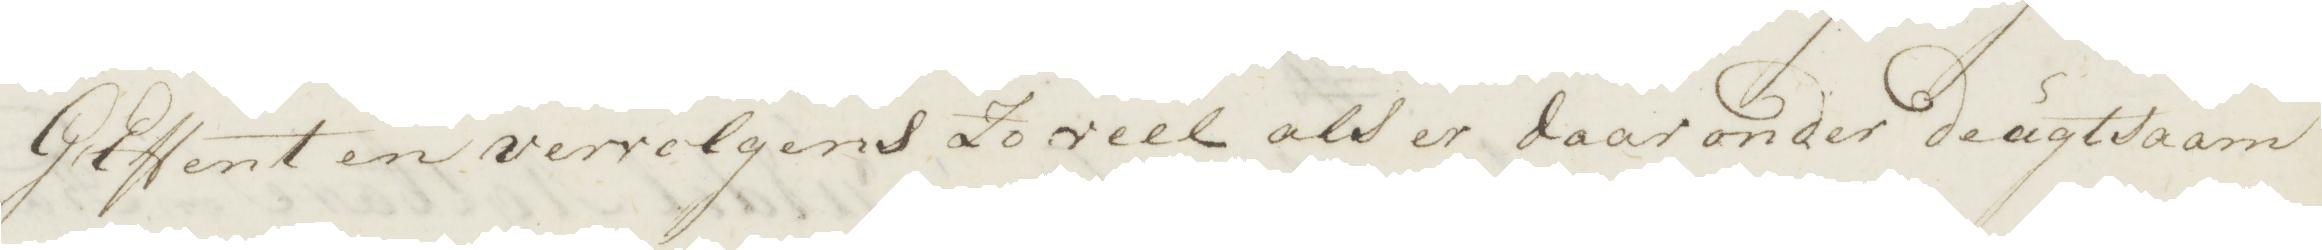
G'Effent en vervolgens zo veel als er daar onder deugtsaam
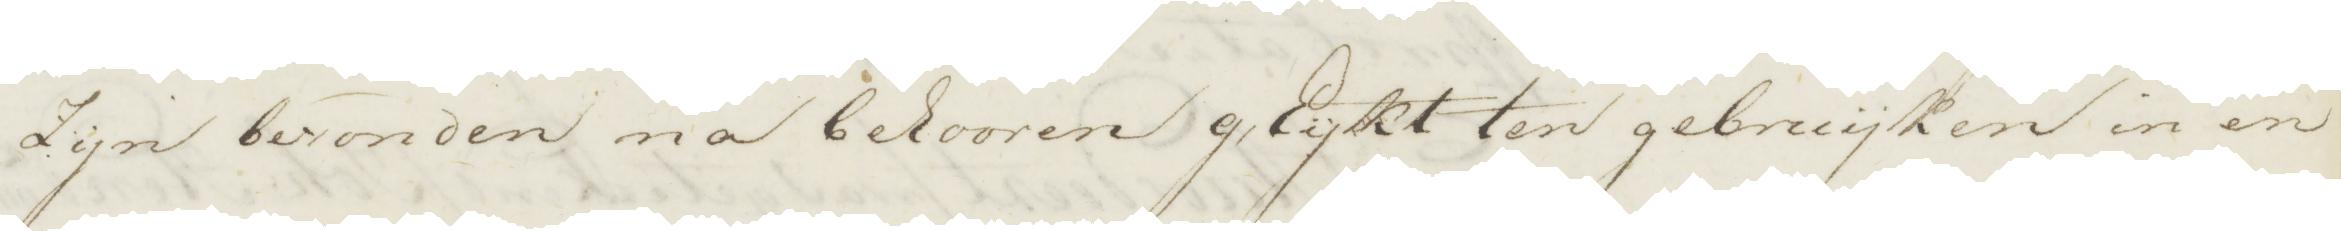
zijn bevonden na behooren g'Eijkt ten gebruijken in en
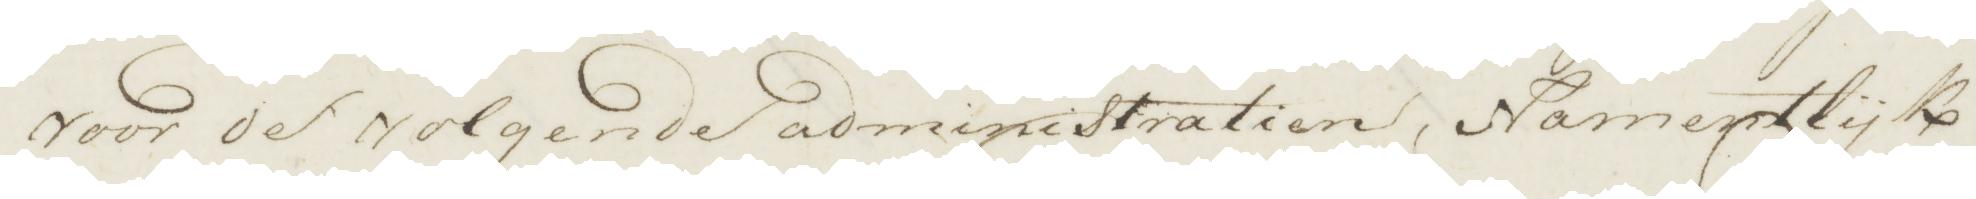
voor de volgende administratien, Namentlijk
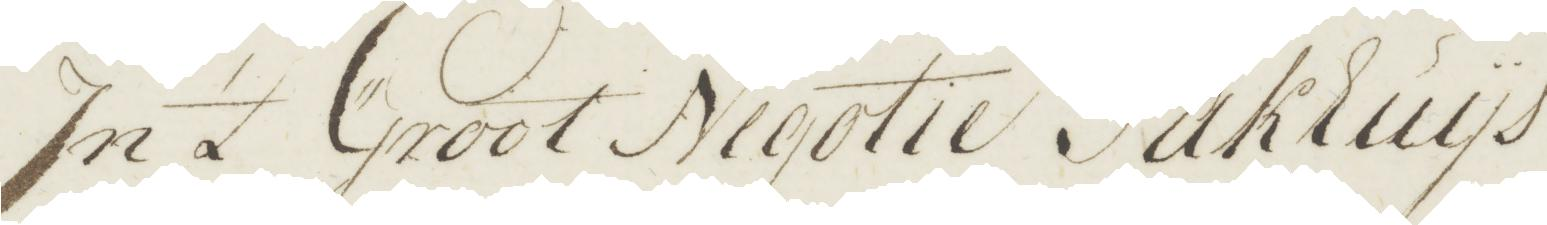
Jn ’t Groot Negotie Pakhuijs
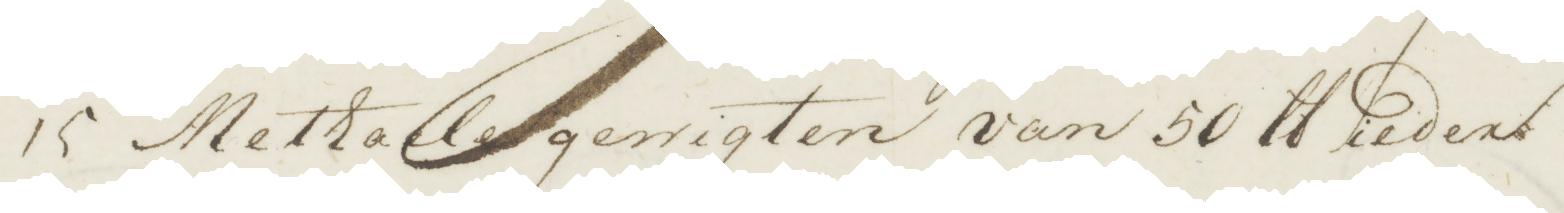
15 Methaele gewigten van 50 lb ieders
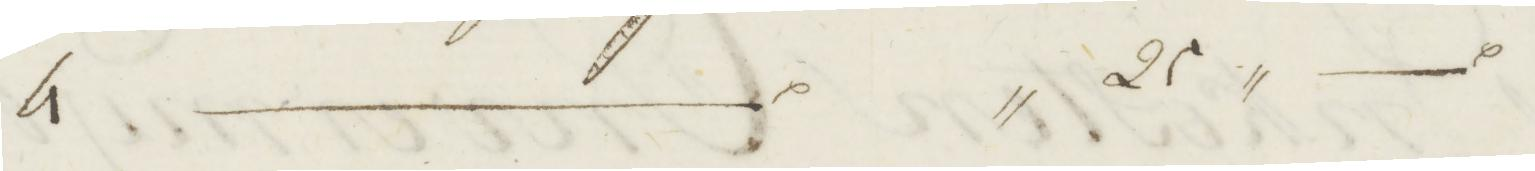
4 _o „ 25 „ _o
